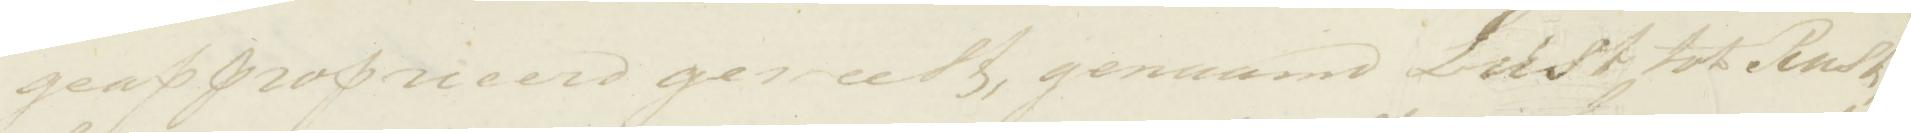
geapproprieerd geweest, genaamd Lust tot Rust,
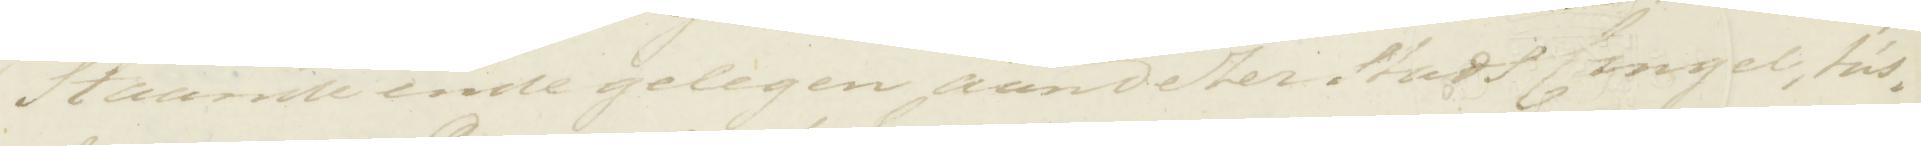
staande ende gelegen, aan dezer stads Cingel, tus„
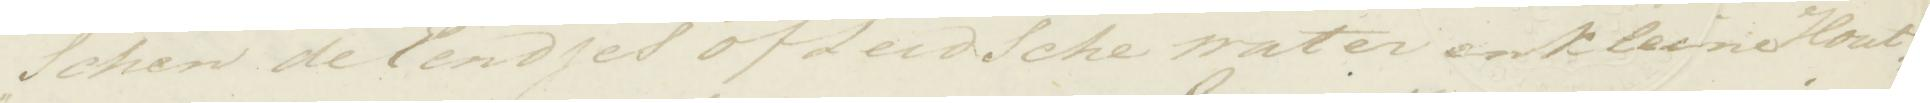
schen de Eendjes of Leidsche water en klein Hout„
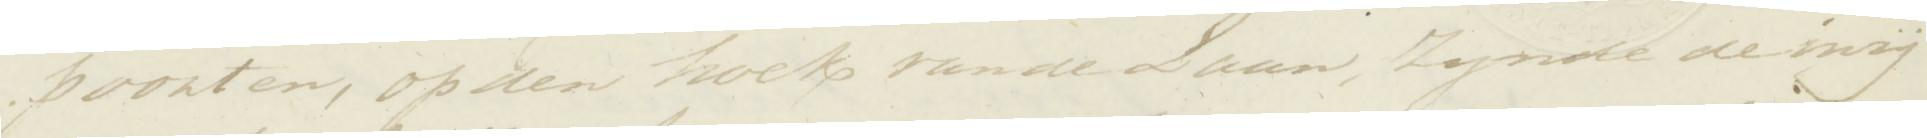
,poorten, op den hoek van de Laan, zynde de inrij
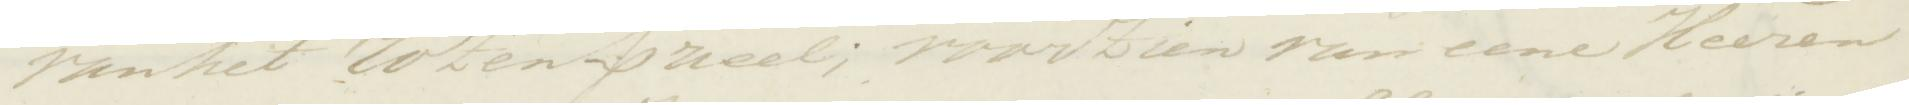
van het rozenprieel; voorzien van eene Heeren
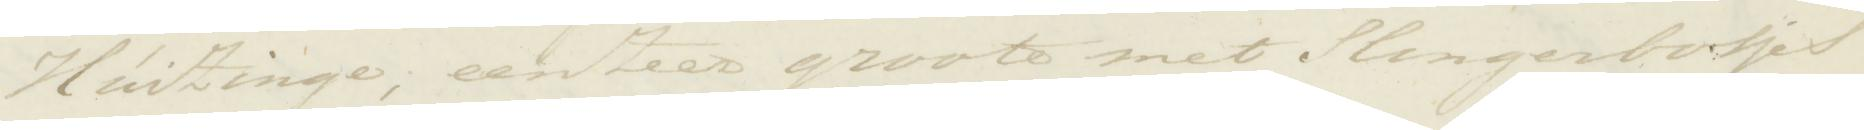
Huizinge; een zeer groote met Slingerbosjes
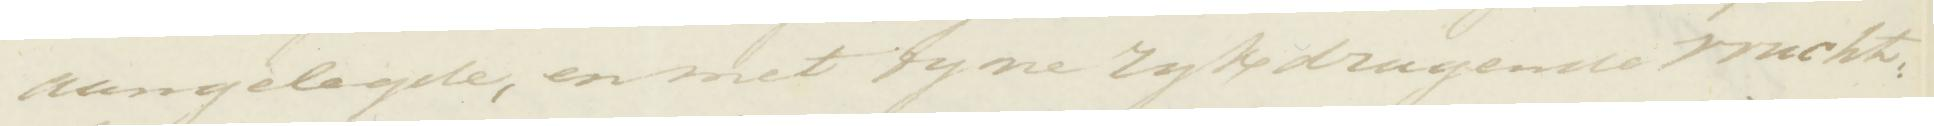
aangelegde, en met fyne rykdragende vrucht„
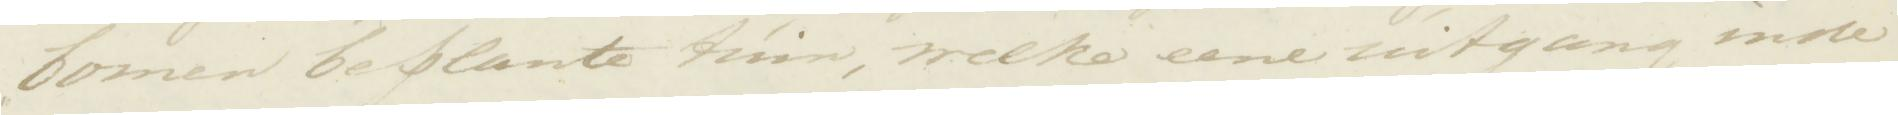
„bomen beplante tuin, welke eene uitgang in de
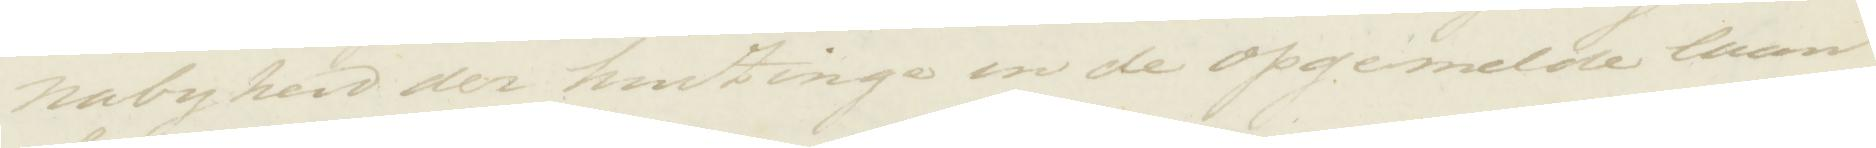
nabyheid der huizinge in de opgemelde laan
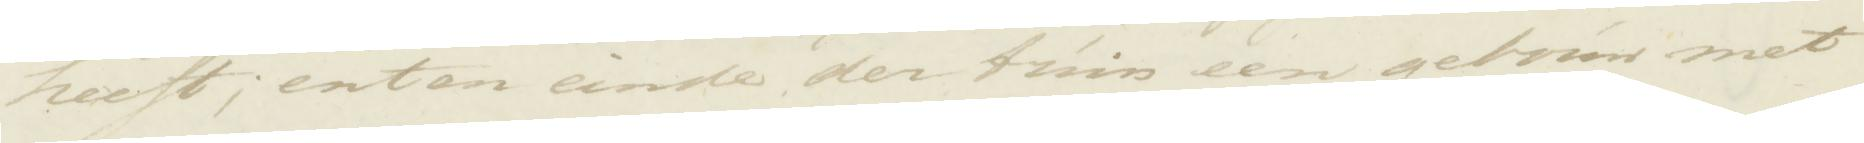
heeft; en ten einde der tuin een gebouw met
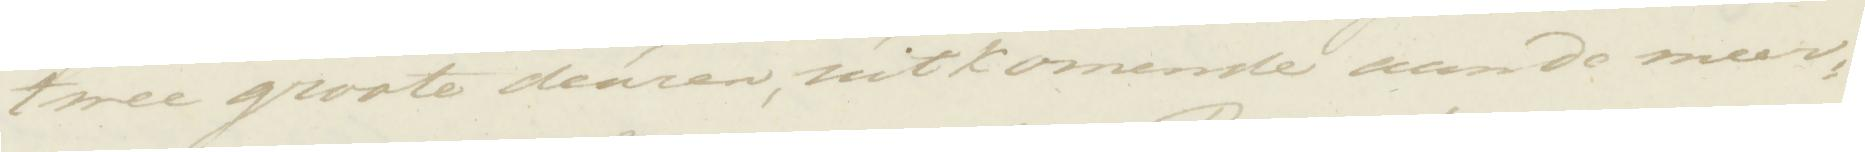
twee groote deuren, uitkomende aan de meer=
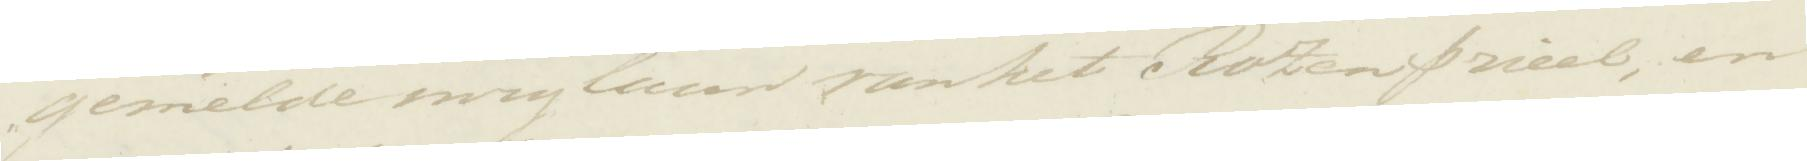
„gemelde inrylaan van het Rozenprieel, en
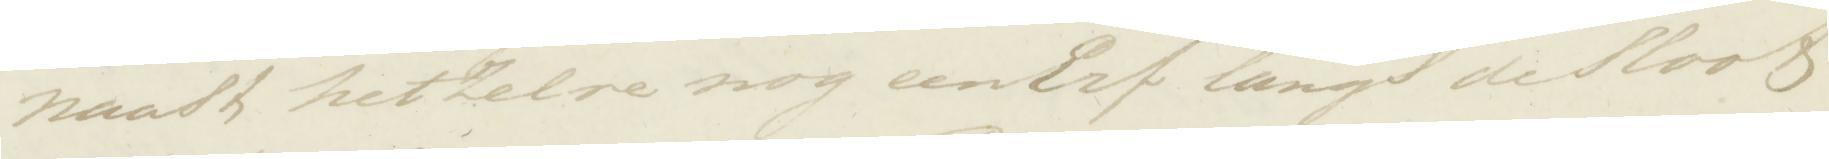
naast hetzelve nog een Erf langs de sloot
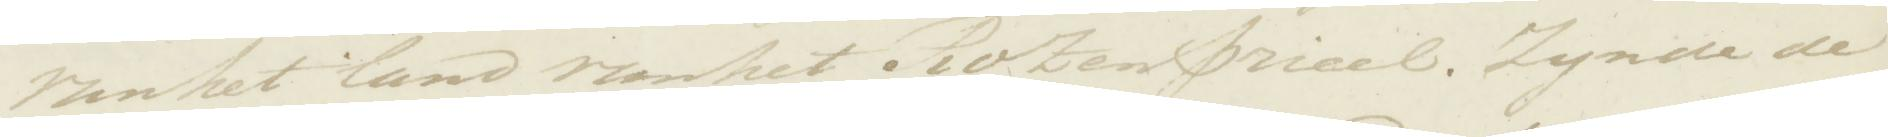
van het land van het Rozenprieel. Zynde de
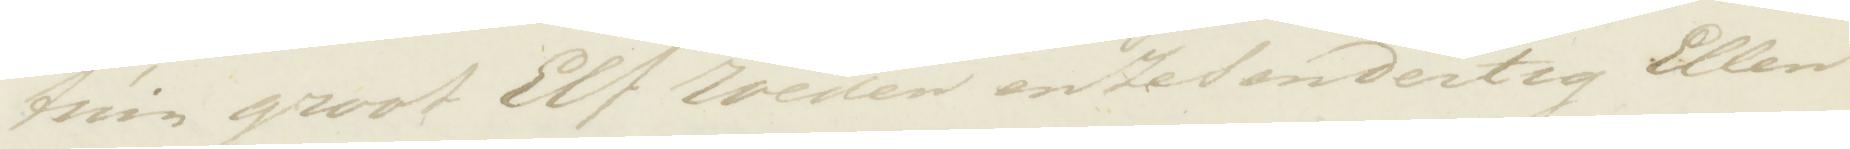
tuin groot Elf roeden en zes en dertig Ellen
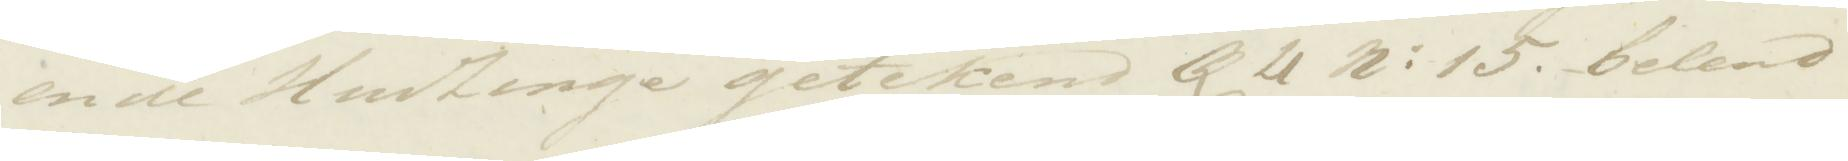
en de Huizinge getekend Q4 n.o 15. belend
